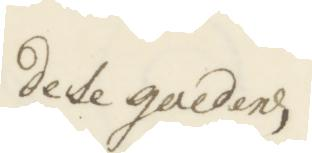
dese goederen
